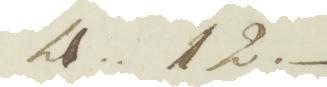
4 .. 12 .—
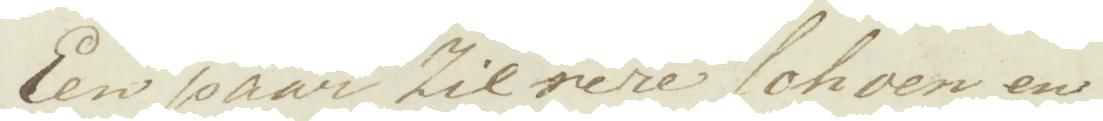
Een paar Zilvere schoen en
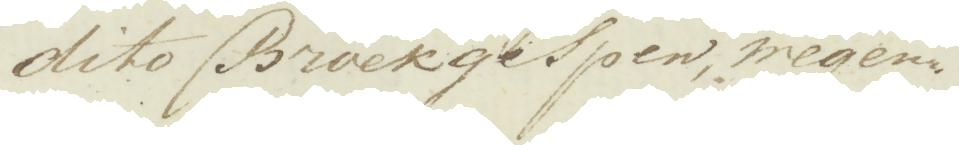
dito Broekgespen, wegen„.
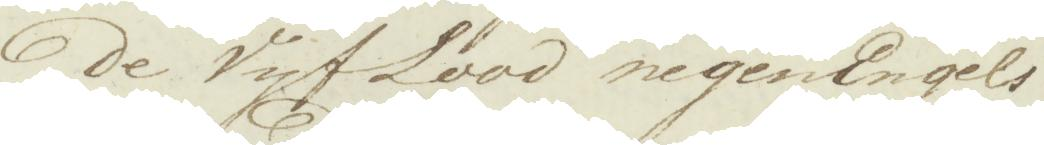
=de Vijf Lood negen Engels
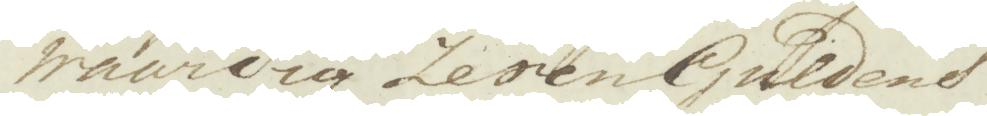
waardig Zeven Guldens
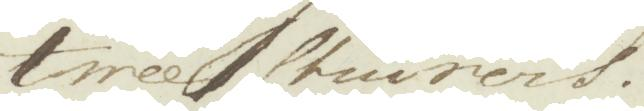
twee stuivers.
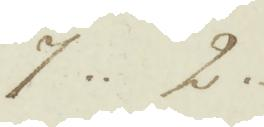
7 .. 2 .
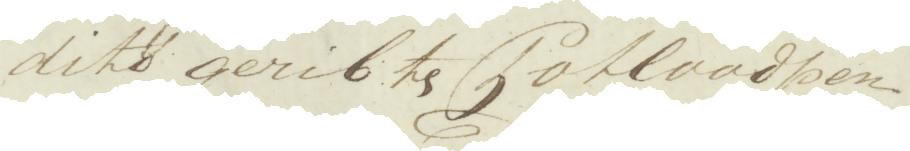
dito geribte Potloodpen
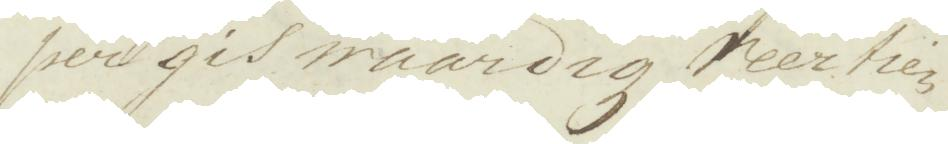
per gis waardig Veertien
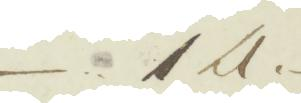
— .. 14 .
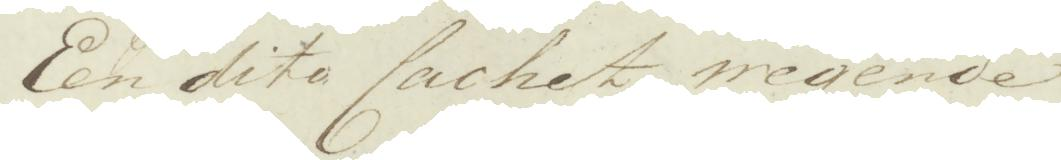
Een dito Cachet, wegende
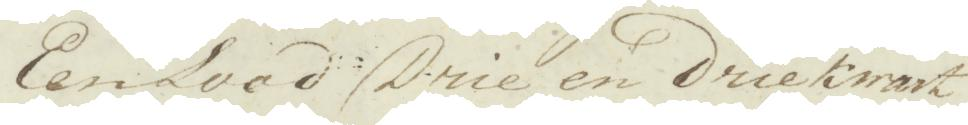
Een Lood Drie en driekwart
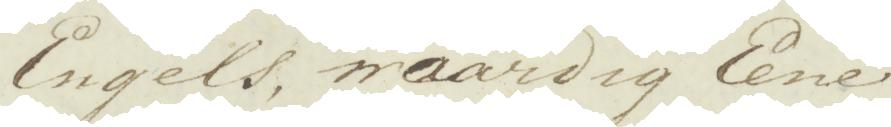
Engels, waardig Eene
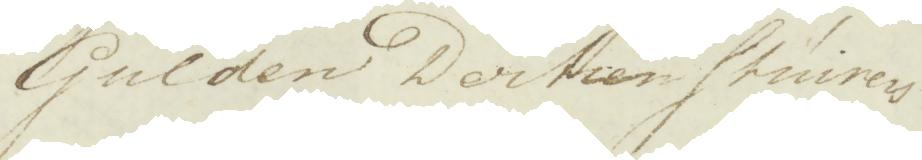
Gulden Dertien stuivers
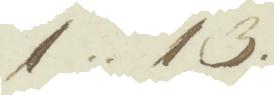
1 .. 13.
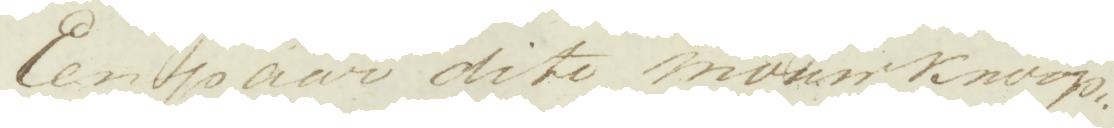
Een paar dito mouw knoop.
